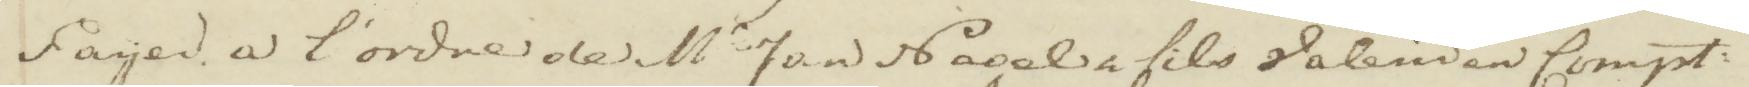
Paijer a l'ordre de M=r Jan Nagel & fils Valeur en Compt:
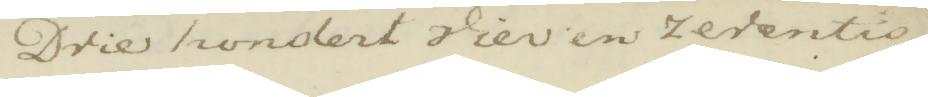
Drie hondert vier en zeventig
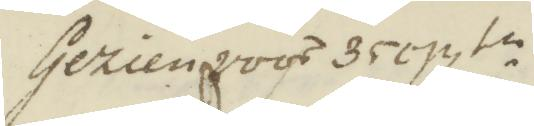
Gezien, voor 35 opC te.
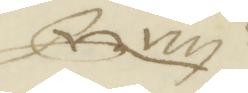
J vin
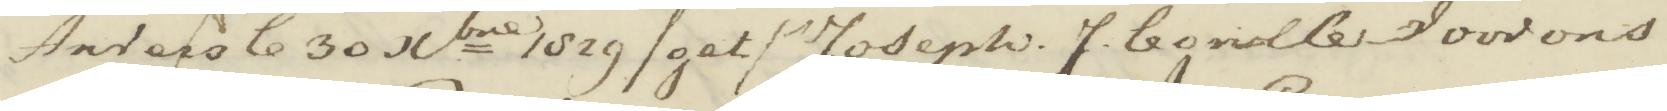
Anvers le 30 X=bre 1829 /get/ Joseph. J. legnolle Voor ons
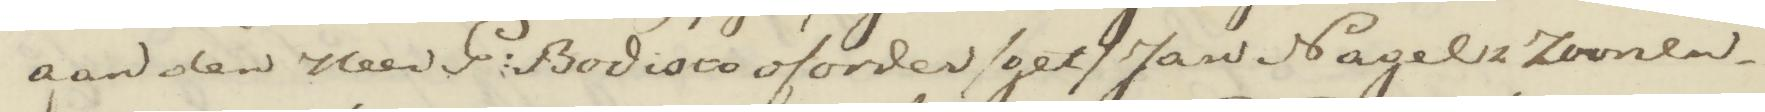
aan den Heer P: Bodisco of order /get/ Jan Nagel & zoonen
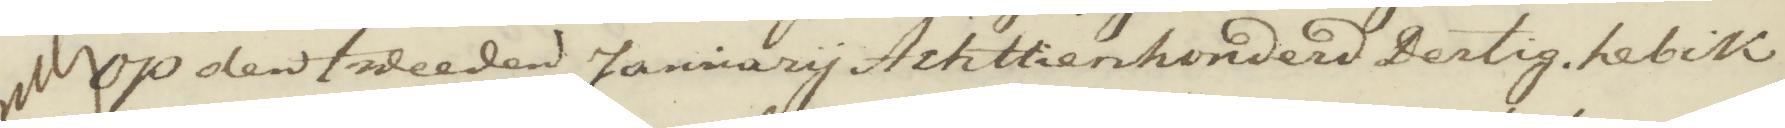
op den tweeden Januarij Achttienhonderd Dertig, heb ik
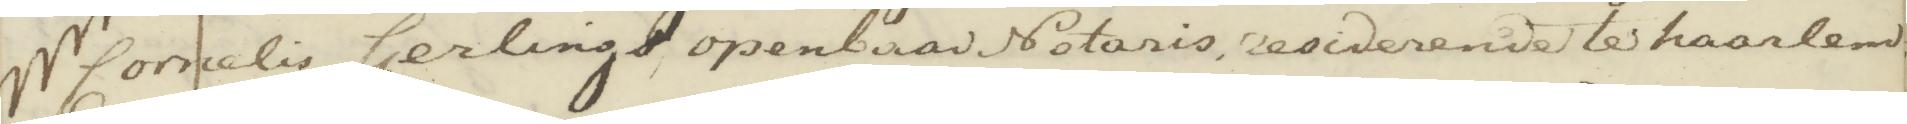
Cornelis Gerlings openbaar Notaris, residerende te haarlem
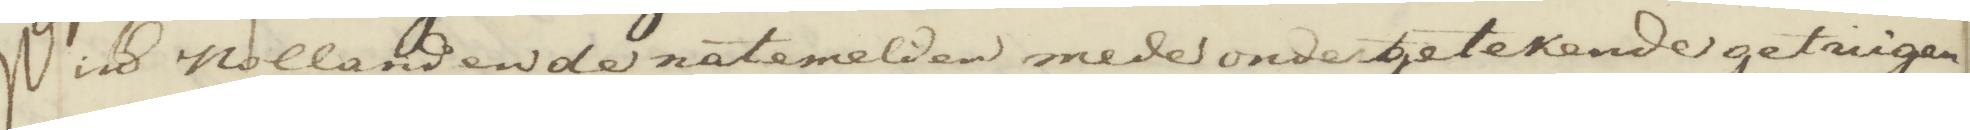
in Holland en de natemelden mede ondergetekende getuigen
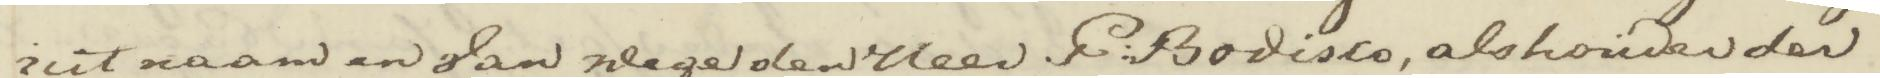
uit naam en Van wege den Heer P: Bodisco, als houder der
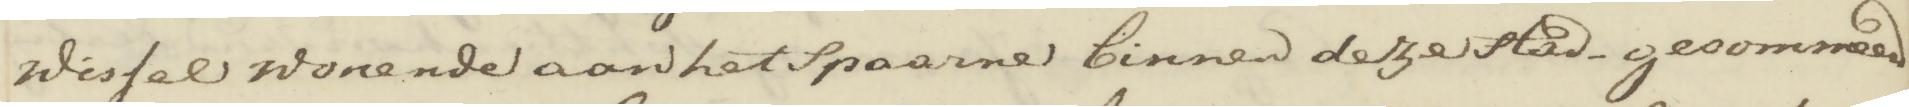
wissel wonende aan het spaarne binnen deze stad- gesommeerd
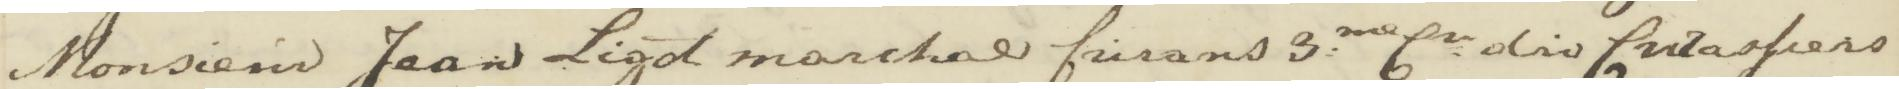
Monsieur Jean Ligot marchal frirons 3:me C:r du Curassiers
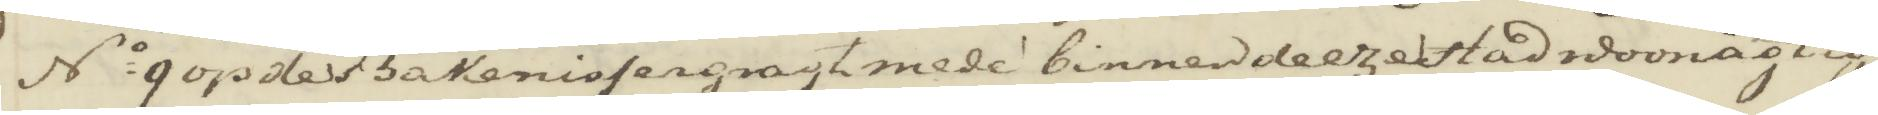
N=o 9 op der Bakenissergragt mede binnen deeze stad woonagtig
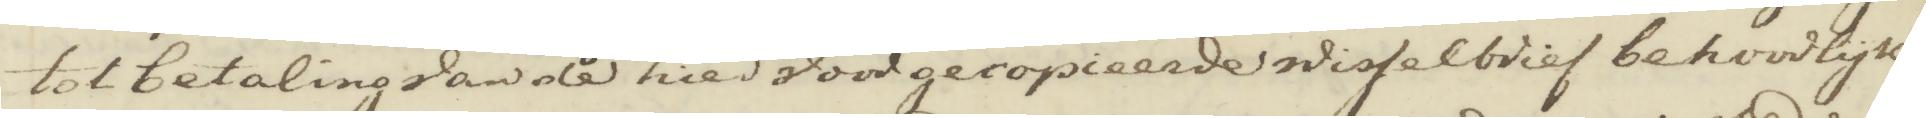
tot betaling van de hier Voor gecopieerde wisselbrief behoorlijk
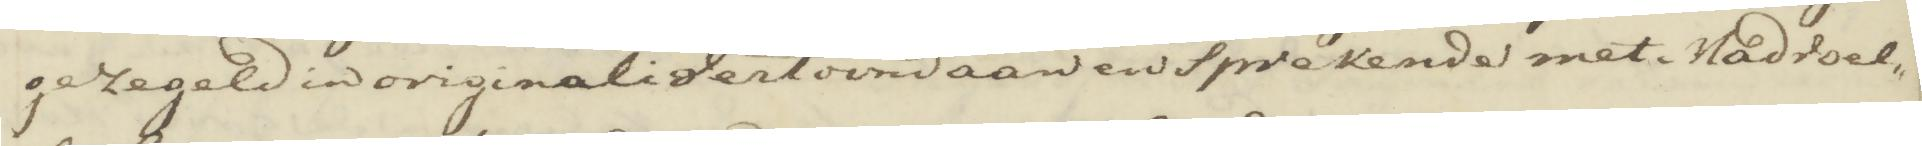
gezegeld in originali Vertoond aan en sprekende met Madroel„
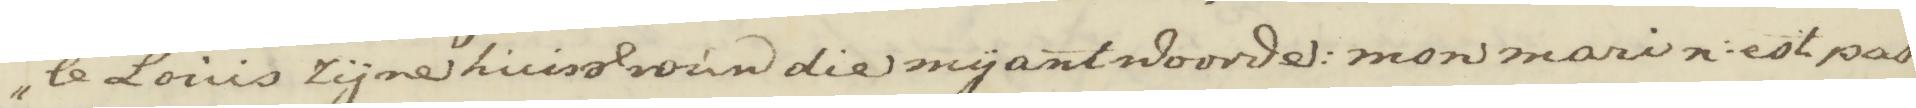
„le Louis zijne huissvouw die mij antwoorde: mon mari n:est pas
